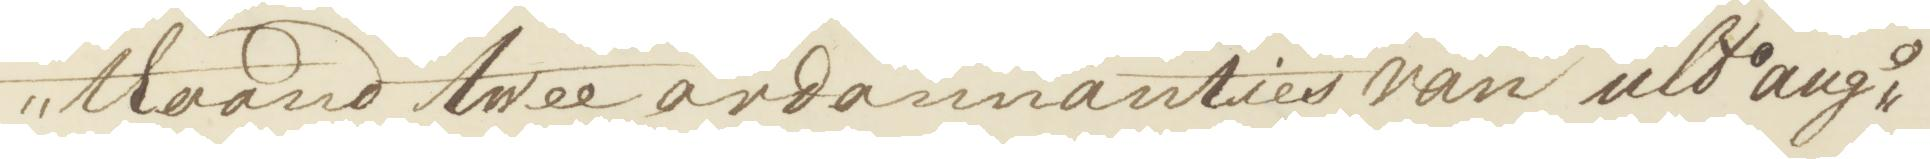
„thoond twee ordannanties van ulto aug„o
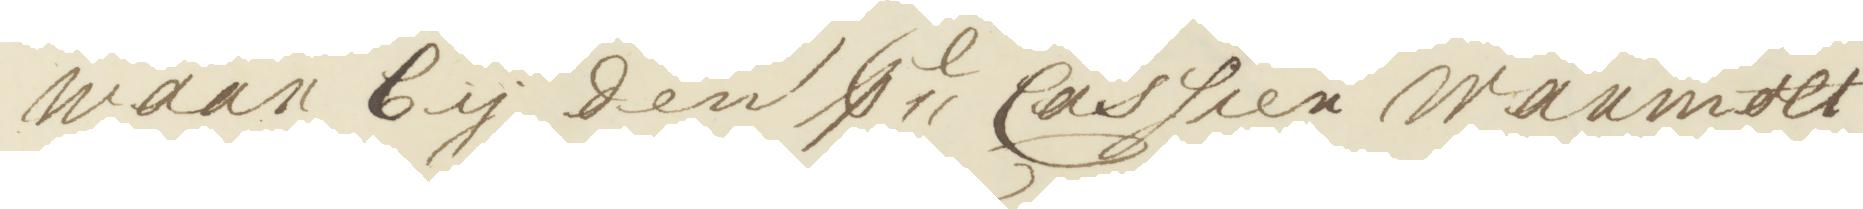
waar bij den p„l Cassier warmolt
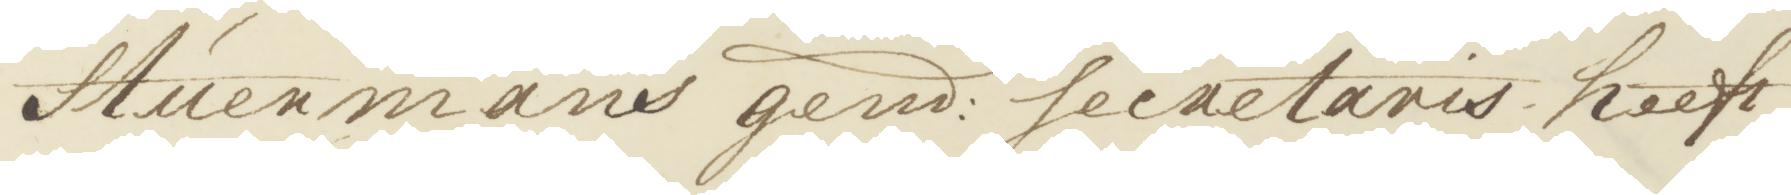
stuermans gem: secretaris heeft
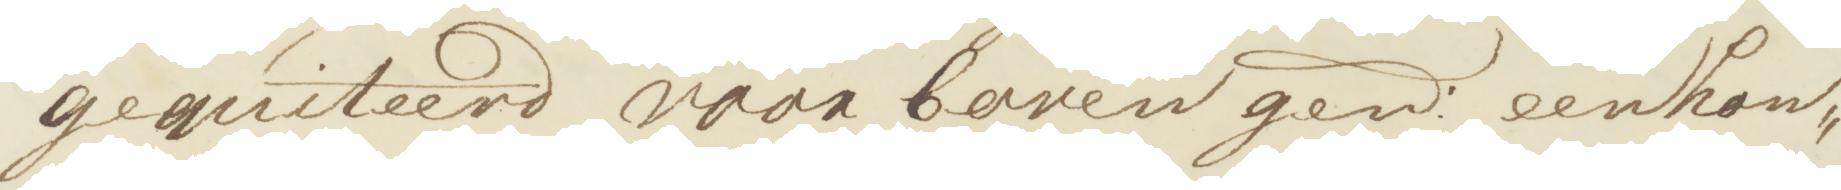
gequiteerd voor boven gen: een hon„
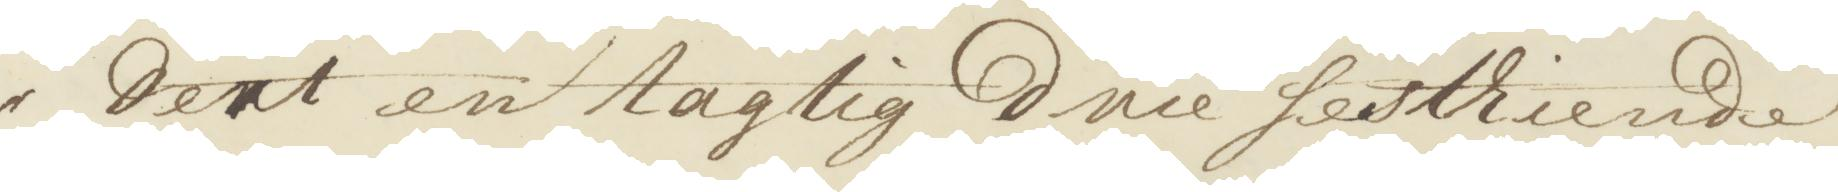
dert en tagtig drie sesthiende
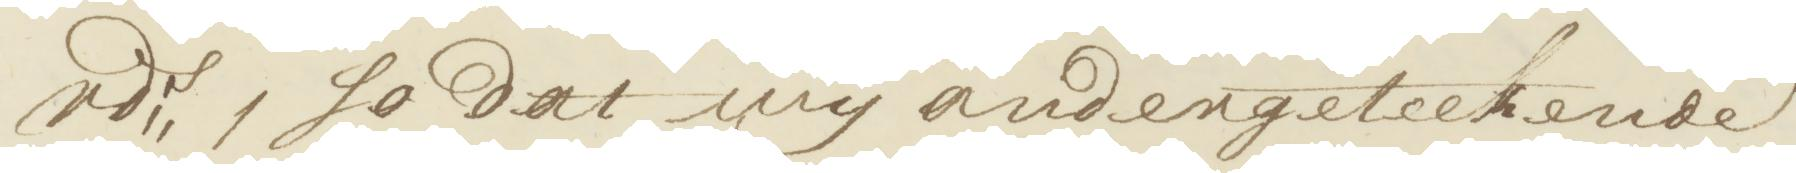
rd„s, so dat wij ondergeteekende
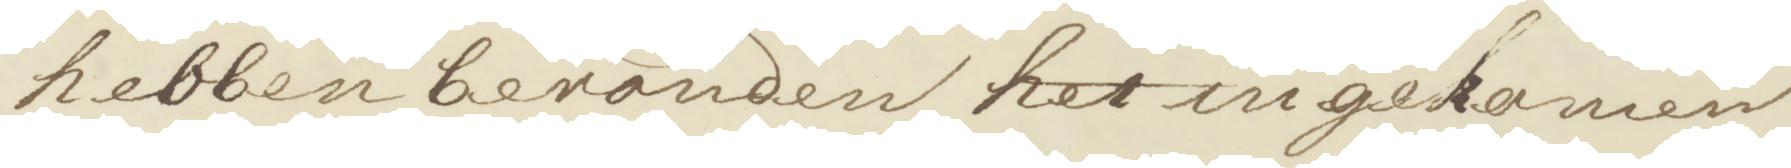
hebben bevonden het ingekomen
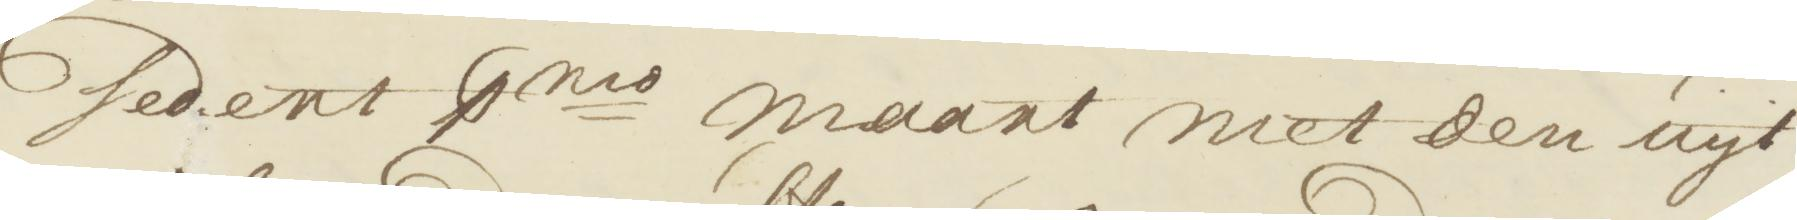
sedert p=mo maart met den uijt
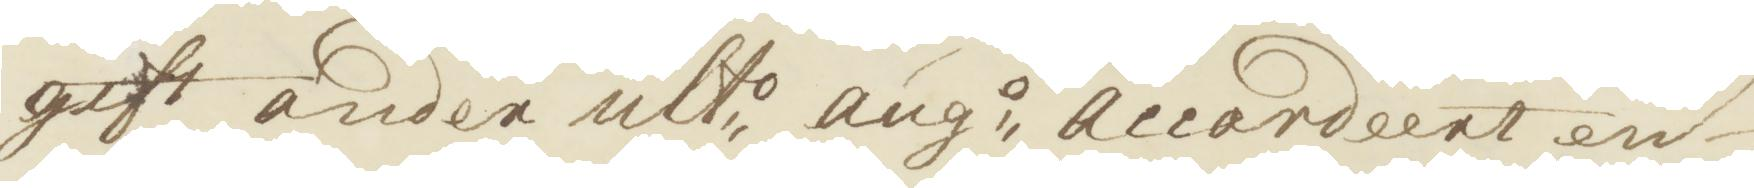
gift onder ult„o aug„o accordeert en
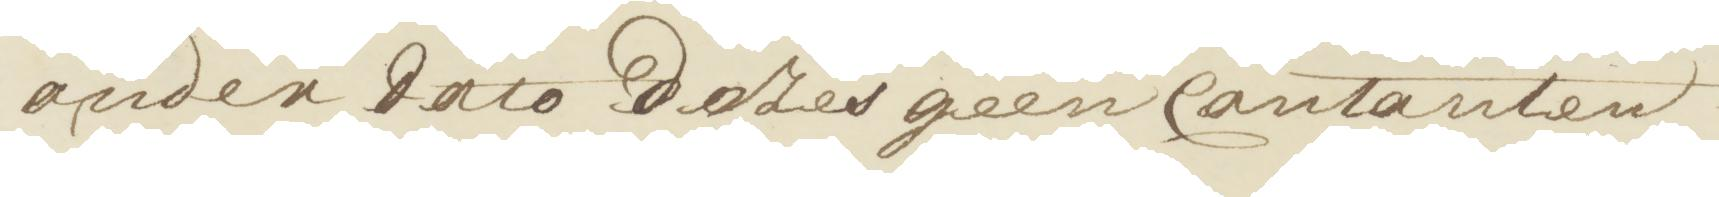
onder dato dezes geen Contanten
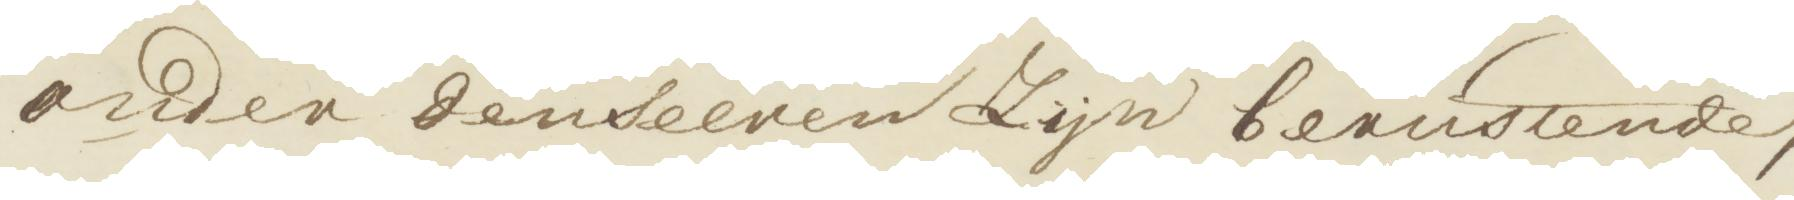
onder denselven zijn berustende,
